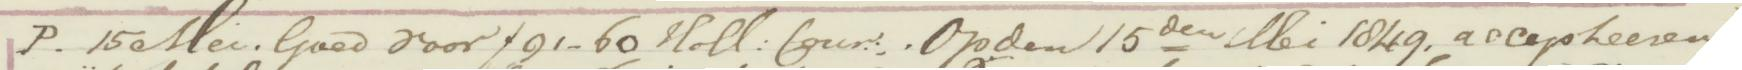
P. 15 Mei. Goed voor ƒ 91. 60 Holl: Cour:. Op den 15=den Mei 1849, accepteeren
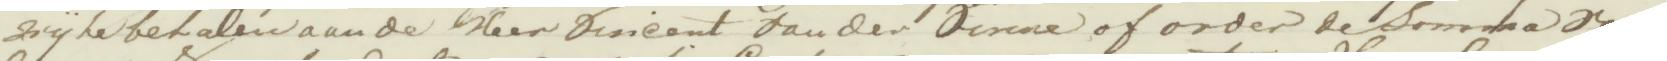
vrij te betalen aan de Heer Vincent van der Vinne of order de Somma van
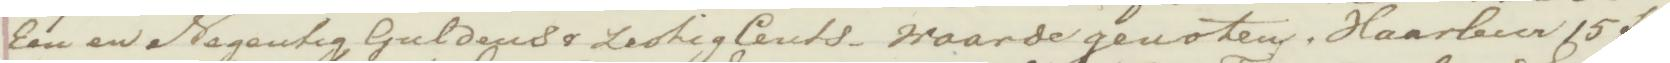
Een en Negentig Guldens & zestig Cents- Waarde genoten, Haarlem 15 fe
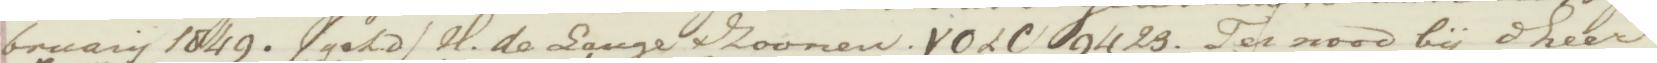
bruarij 1849. (getd) H. de Lange & Zoonen. VOLC 9423. Ter nood bij dheer
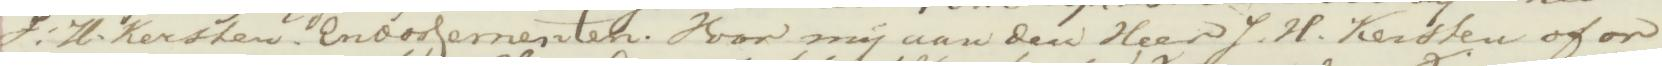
I: H. Kersten. Endorsementen. Voor mij aan den Heer J. H. Kersten of or
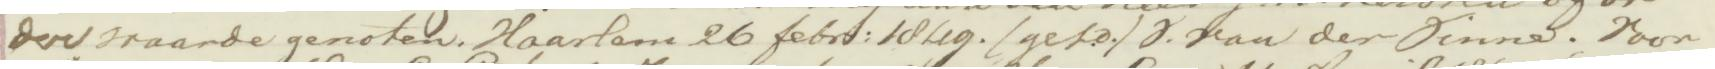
der waarde genoten, Haarlem 26 febr: 1849. (getd:) V. van der Vinne. Voor
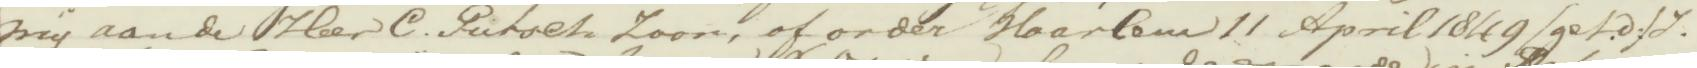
mij aan de Heer C. Putsch zoon, of order Haarlem 11 April 1849 (get.d:) I.
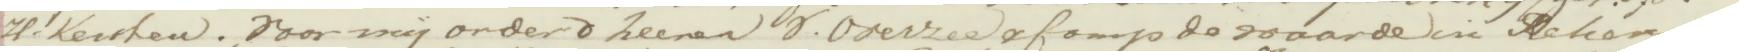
H. Kersten. Voor mij order de heeren V. Overzee & Comp de waarde in Rekening
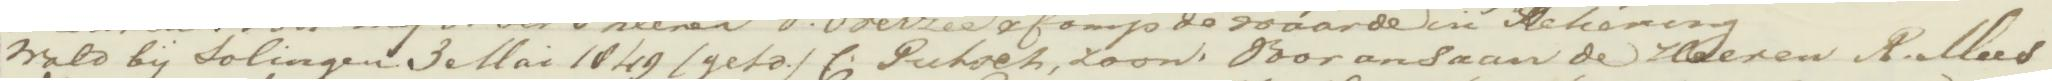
Wald bij Solingen 3 Mai 1849 (getd.) C: Putsch, zoon. Voor ons aan de Heeren R. Mees
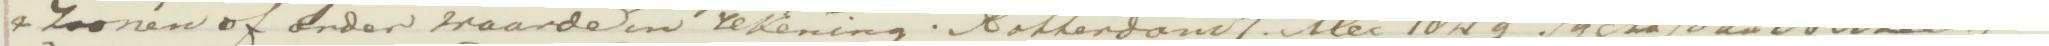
& Zoonen of order waarde in rekening. Rotterdam 7. Mei 1849. (getd) Van Overzee & C.o
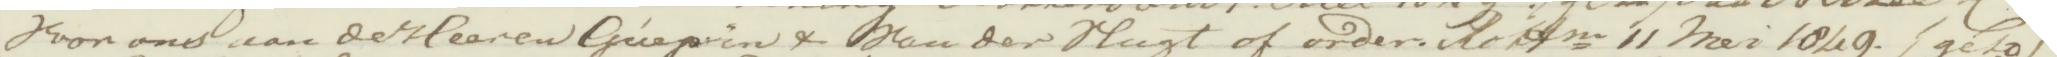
Voor ons aan de Heeren Guépin & Van der Vlugt of order. Rott=m 11 Mei 1849. (get.d)
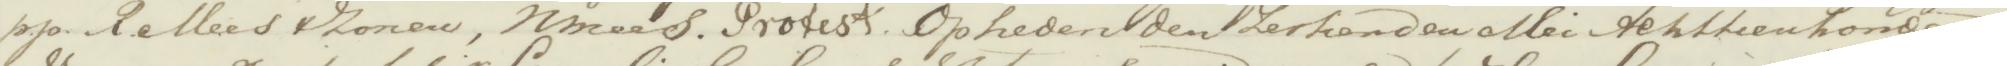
p.p. Rellees & Zonen, NMees. Protest. Op heden den Zestienden Mei Achttienhonderd
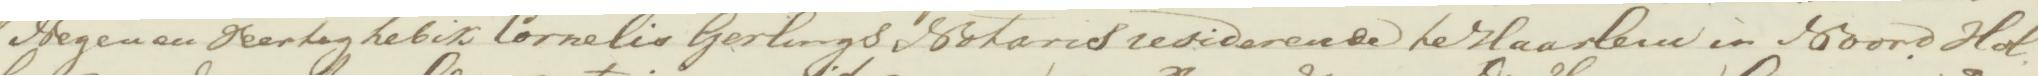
Negen en Veertig heb ik Cornelis Gerlings Notaris residerende te Haarlem in Noord Hol,
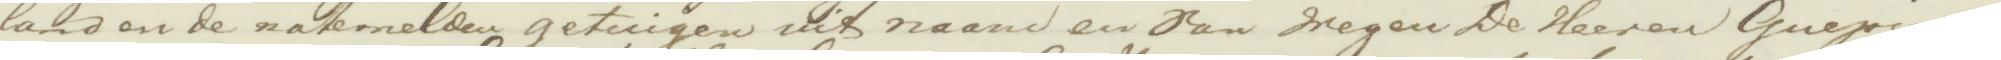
land en de natemelden getuigen uit naam en Van Wegen De Heeren Guepin &
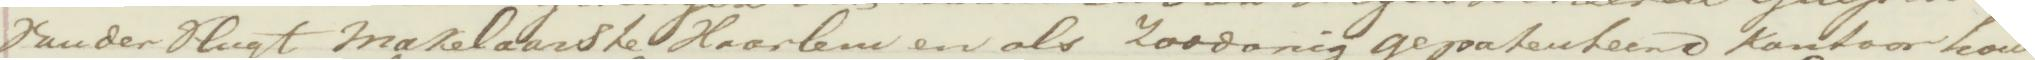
Van der Vlugt Makelaars te Haarlem en als zoodanig gepatenteerd kantoor hou
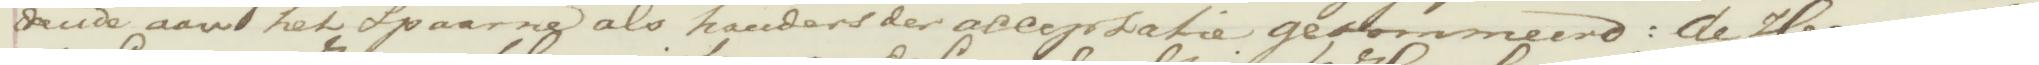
dende aan het spaarne als houders der acceptatie gesommeerd: de Heeren H.
